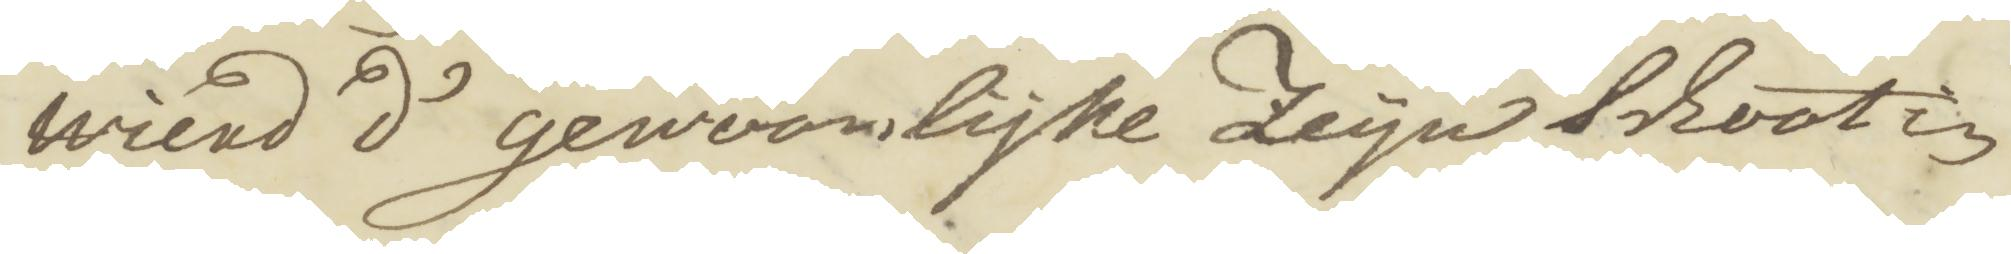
wierd d’ gewoonlijke zeijn schoot in
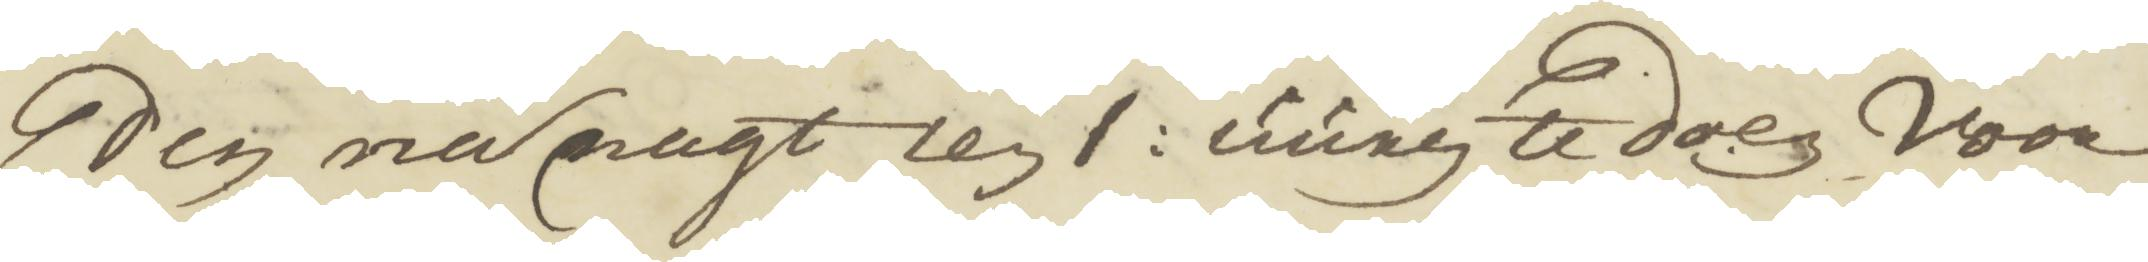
den na nagt ten 1: uuren te doen voor
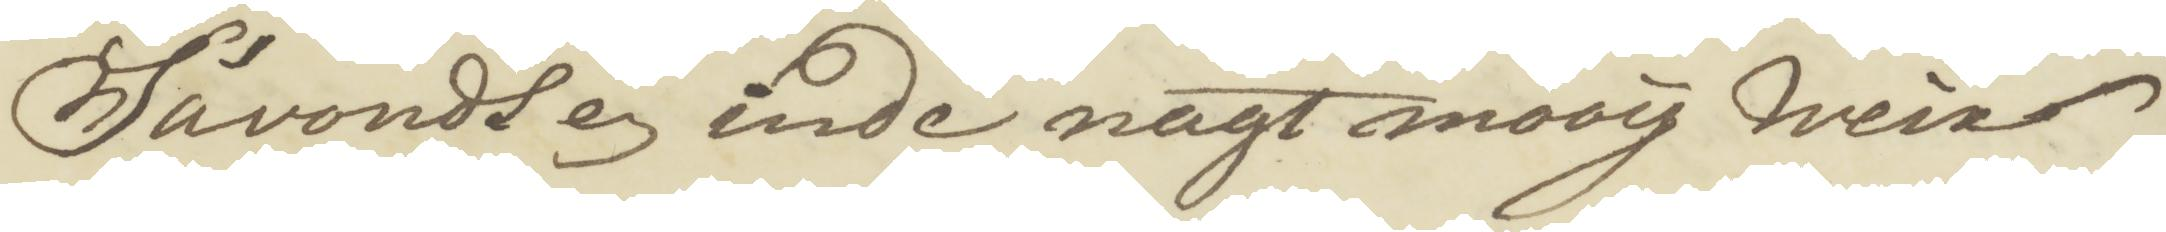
S'avonds en inde nagt mooij weir
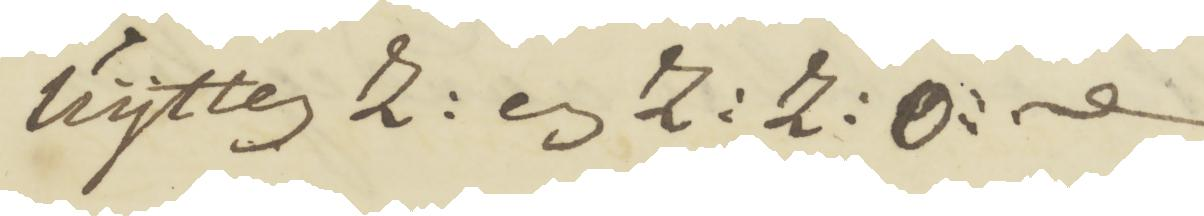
uijtten z: en z:z:o:
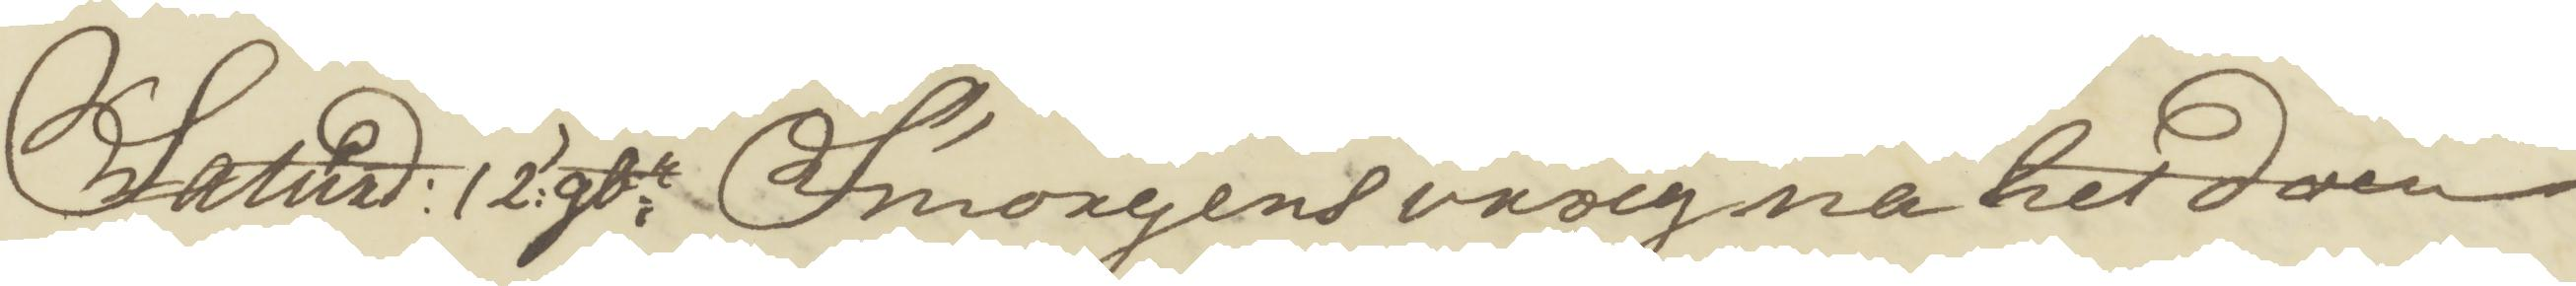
Saturd: 12:' 9b=r S'morgens vroeg na het doen
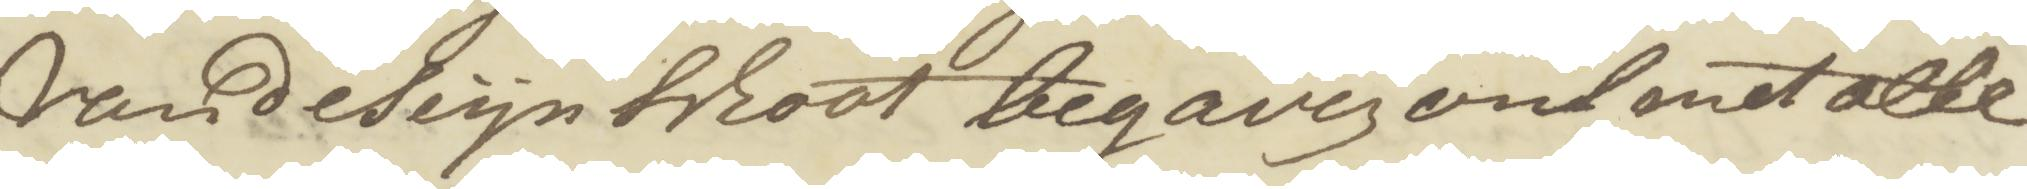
van de seijn schoot begaven ons met alle
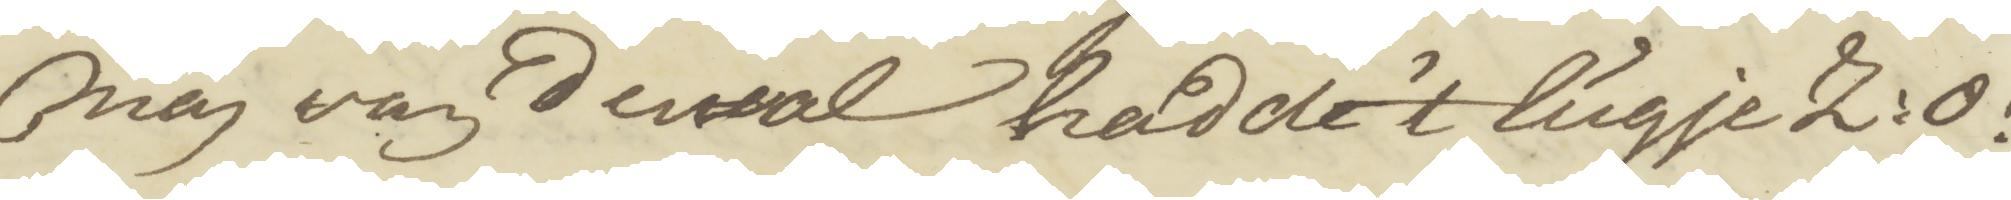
man van dewal hadde ’t lugje z:o:
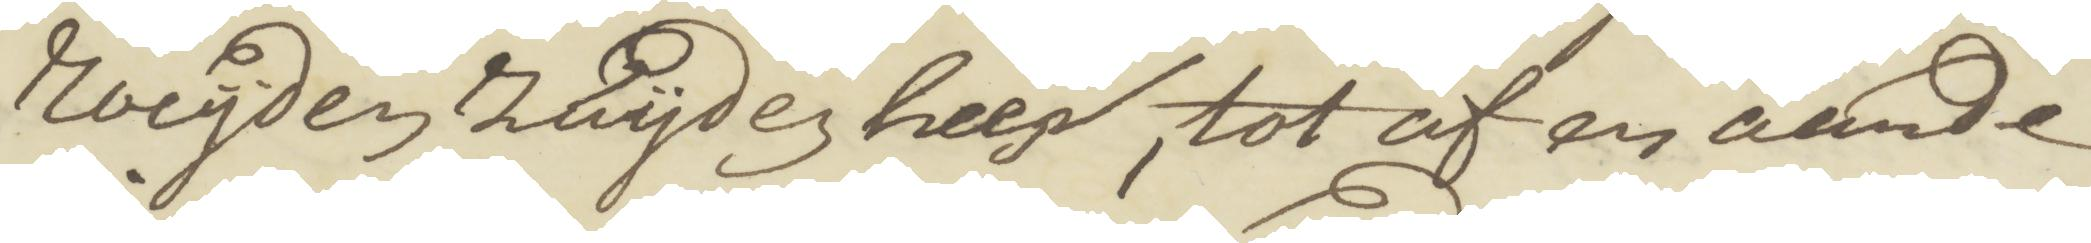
roeijden zuijden heen, tot af en aan de
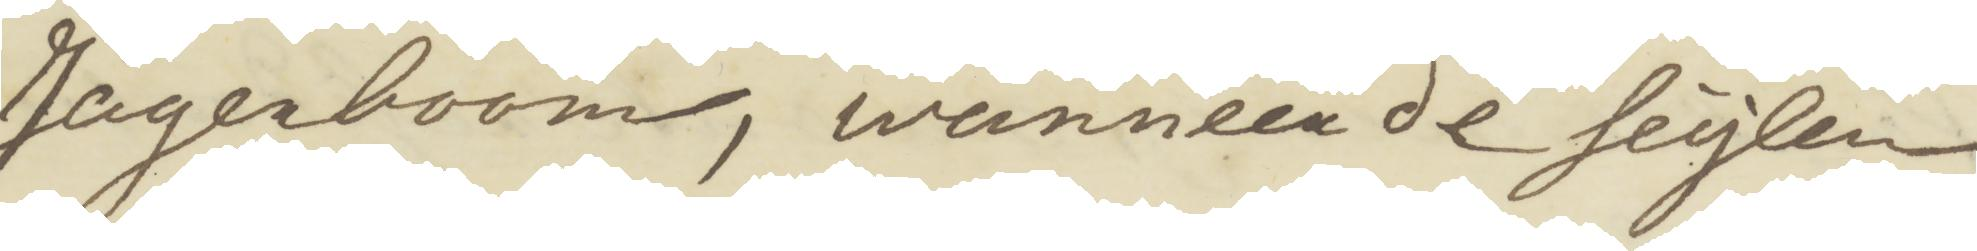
Jagerboom, wanneer de seijlen
